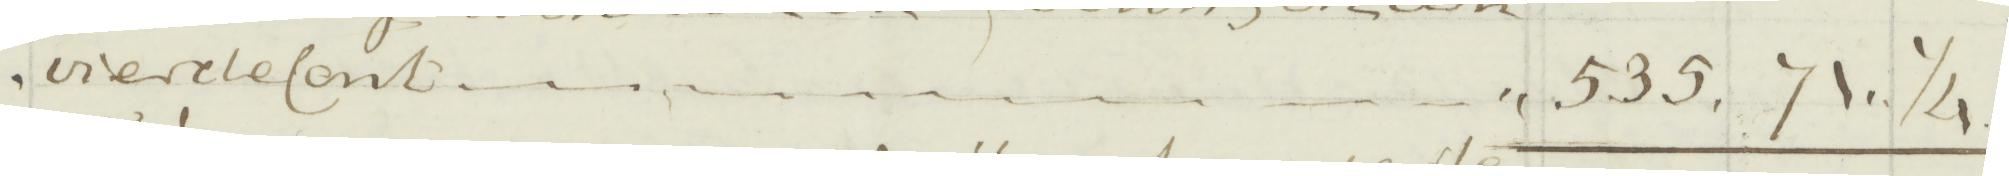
vierde Cent - - - - - - - - - - - - „ 535, 71„¼
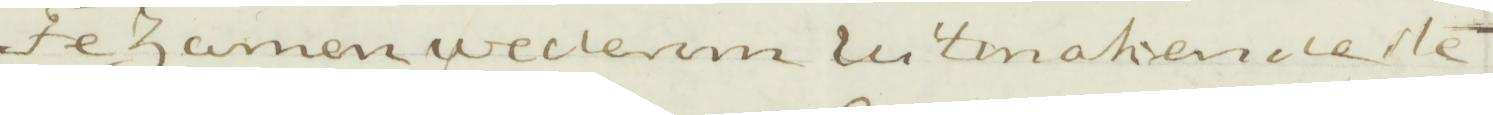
Te Zamen wederom uitmakende de
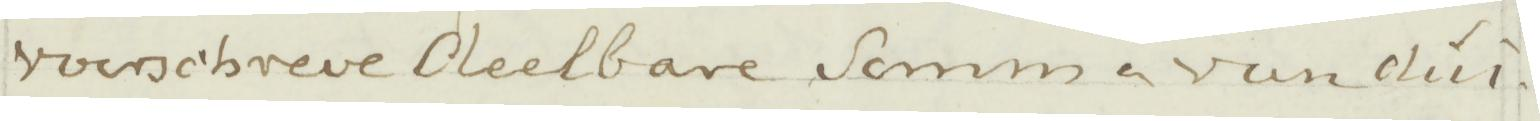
voorschreve deelbare somma van dui.
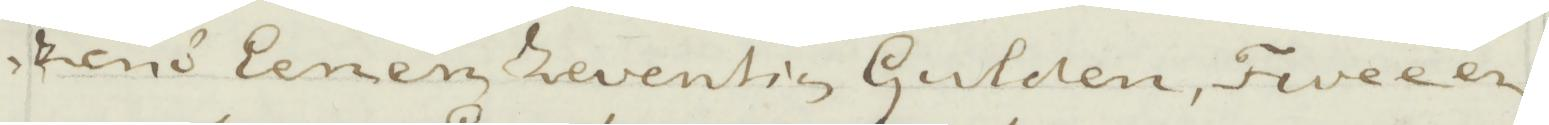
„zend Een en zeventig Gulden, Twee en
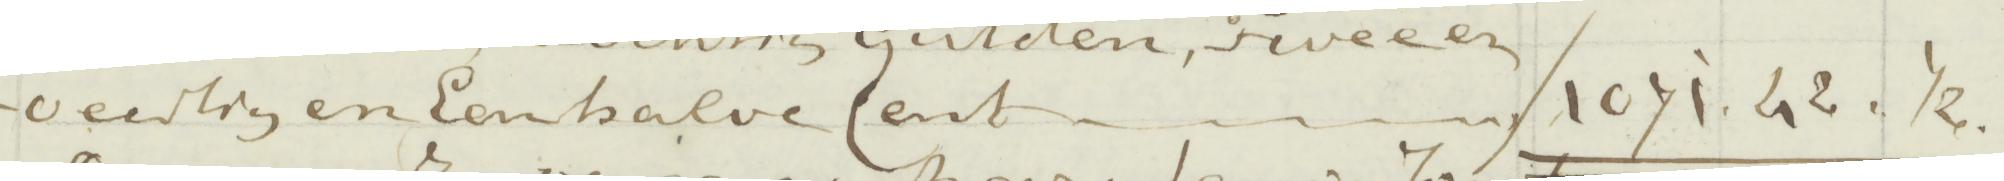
veertig en Een halve Cent - - - - - - ƒ1071.42„½.
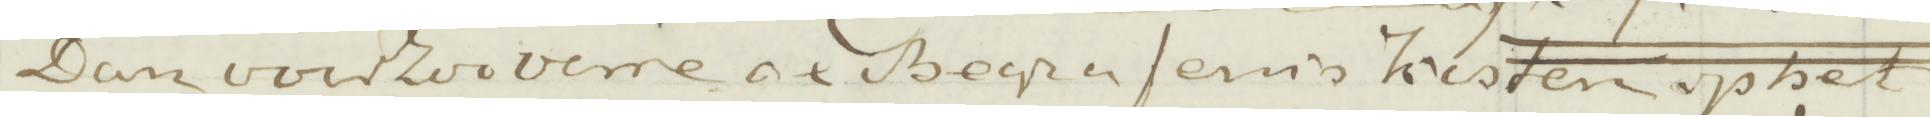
Dan voor zoo verre de Begrafenis kosten op het
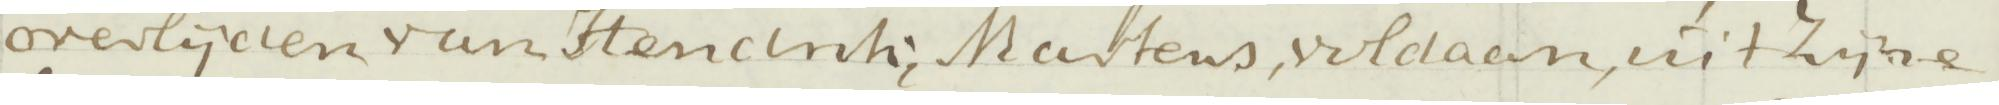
overlijden van Hendrik Martens, voldaan, uit zijne
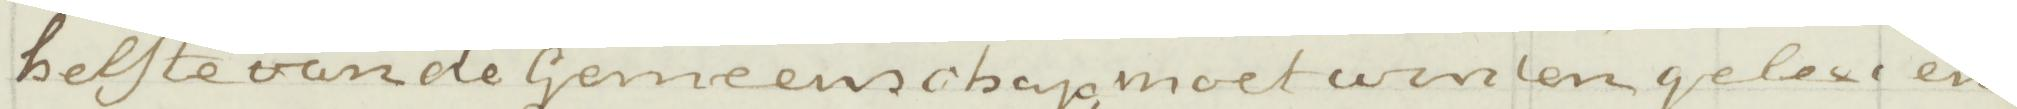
helfte van de Gemeenschap, moet worden geleed en
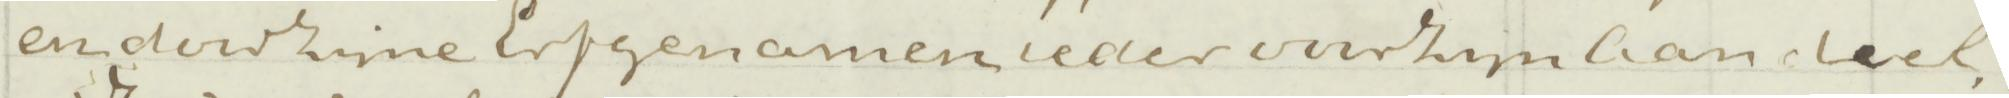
en door zijne Erfgenamen ieder voor zijn aandeel,
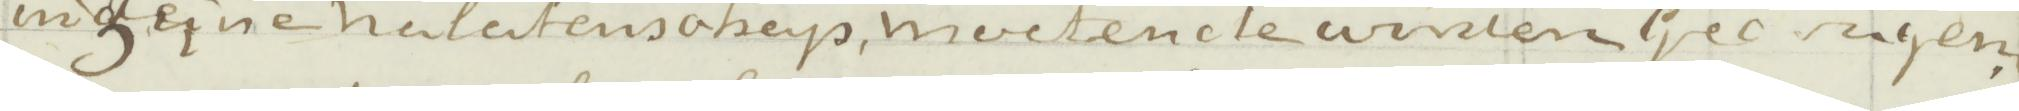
in zijne nalatenschap, moetende worden Gedragen,
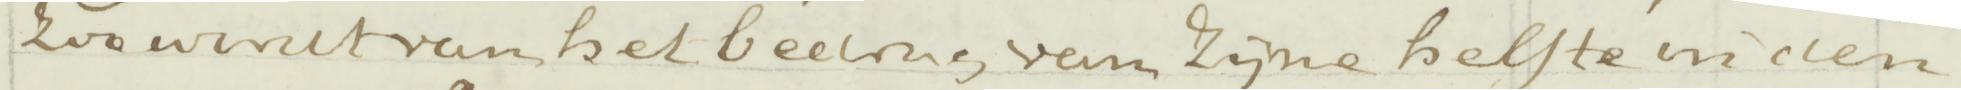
zoo wordt van het bedrag van zijne helfte in den
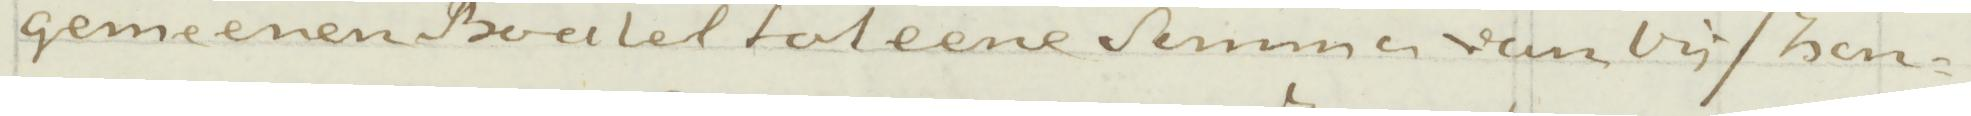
gemeenen Boedel tot eene Somma van vijf hon=
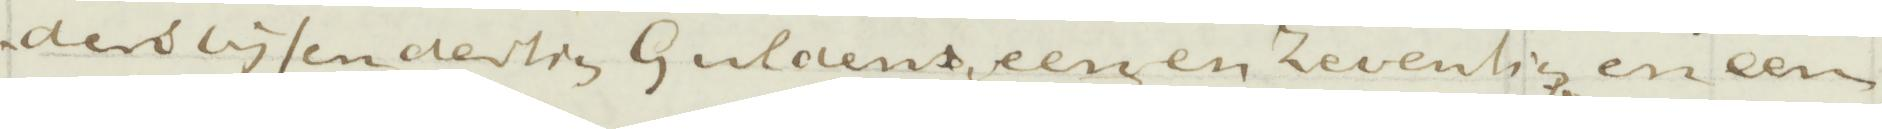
=derd vijfen dertig Guldens, een en Zeventig en een
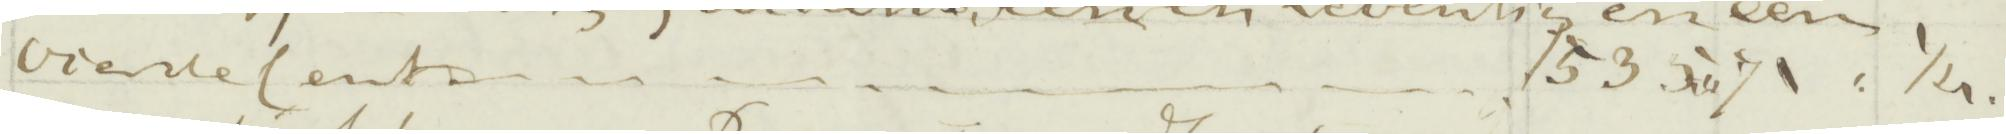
vierde Cents - - - - - - - - - - - - - ƒ535„71 „ ¼
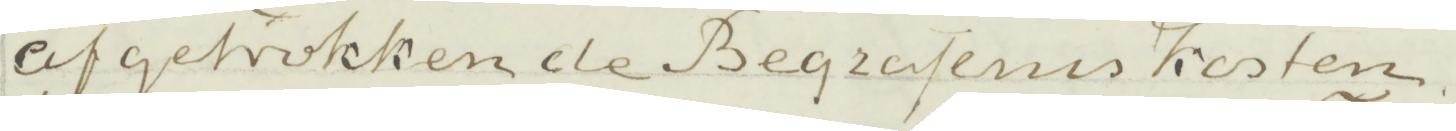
afgetrokken de Begrafenis kosten.
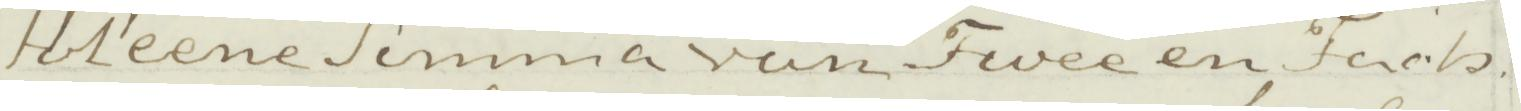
tot eene Somma van Twee en Tach.
